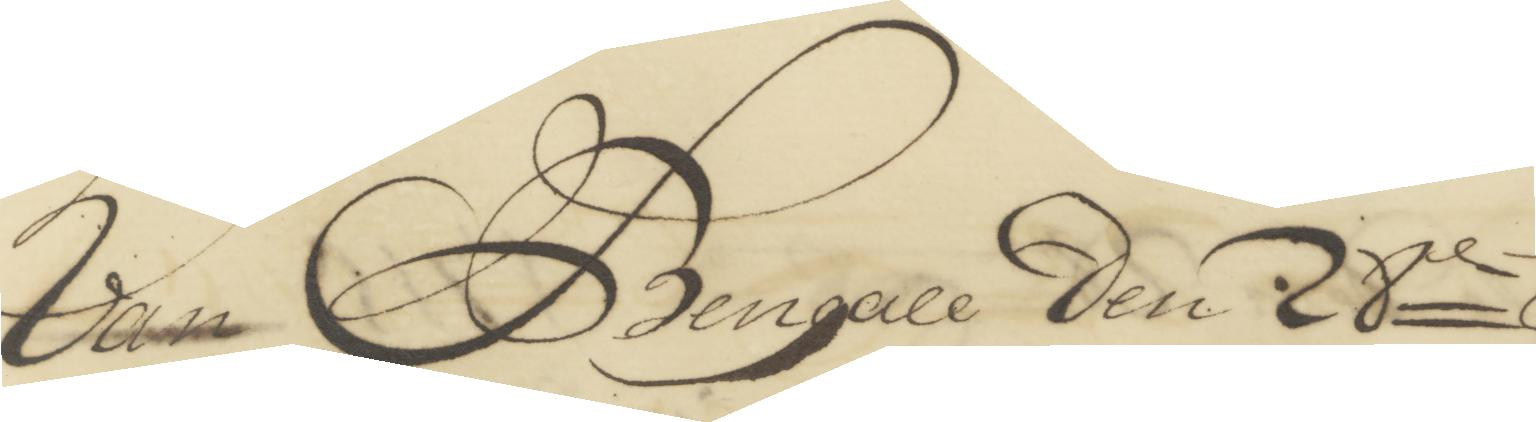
Van Bengale den 28=e xb=r 1715.
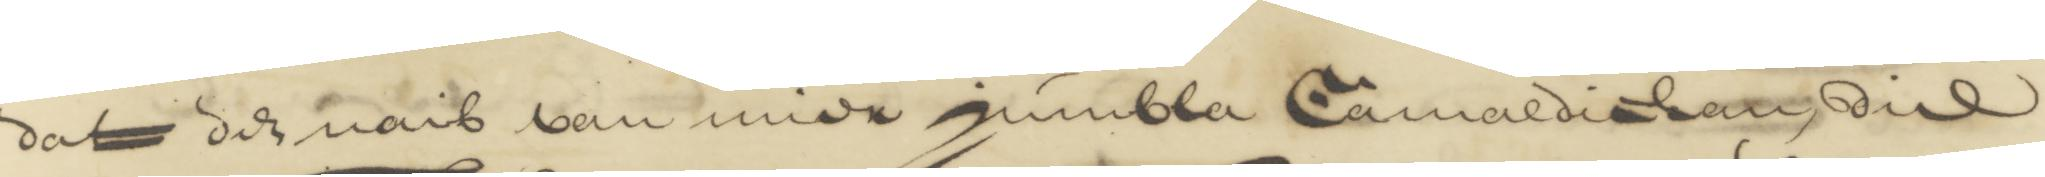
dat den naib van mier jumbla Camaldichan, die
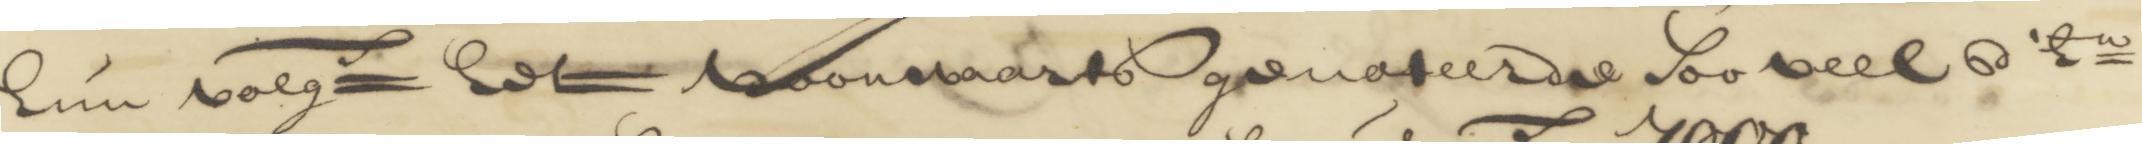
hun volg=s het voorwaarts genoteerde soo veel d’ h=w
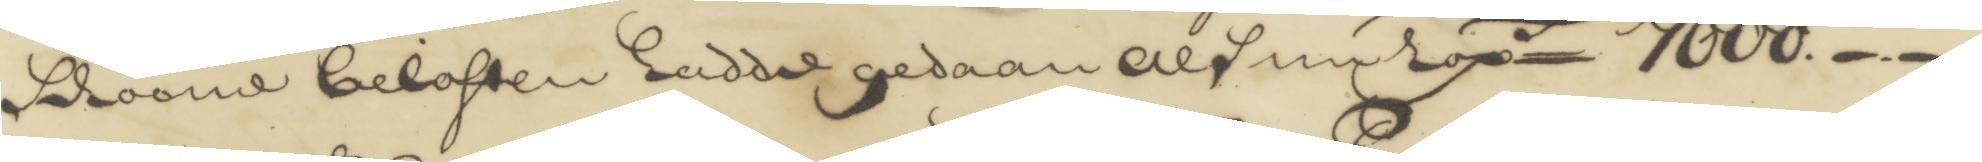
schoone beloften hadde gedaan als nu rop=s 7000.–.–.
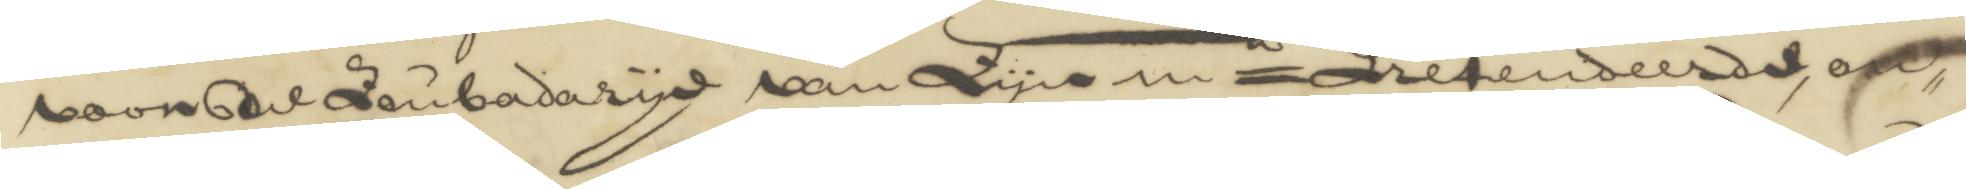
voor de zoubadarije van zijn m=r Pretendeerde, on„
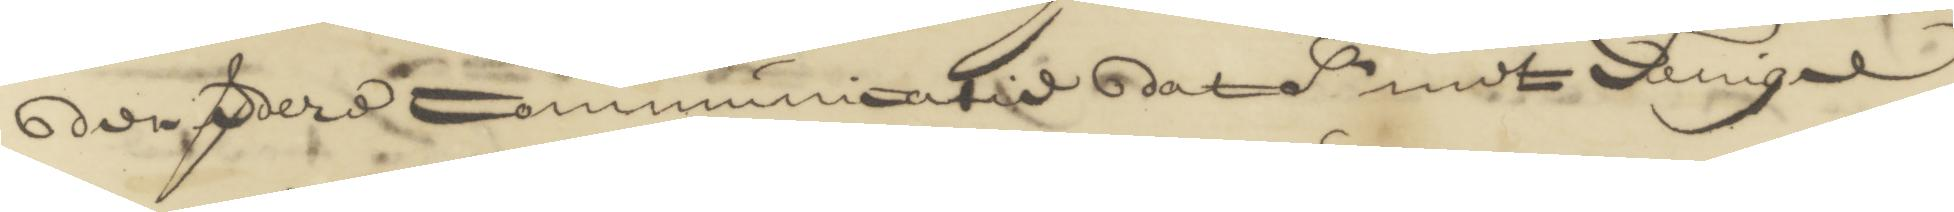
der verdere communicatie dat s' met Eenige
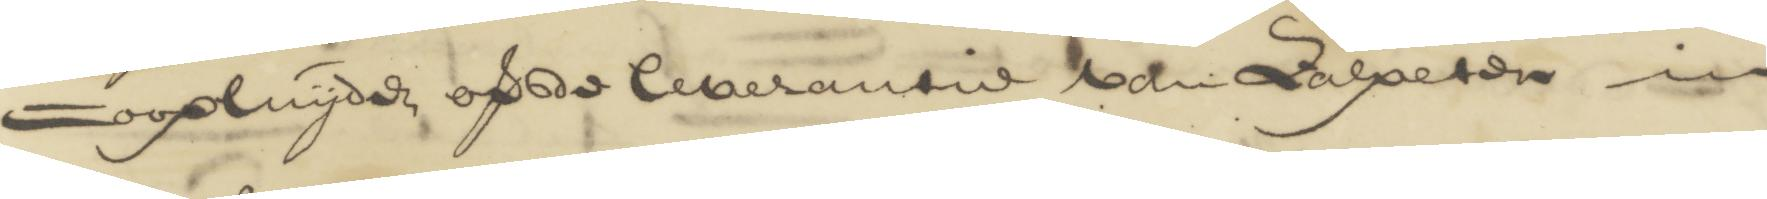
coopluijden over de leverantie van zalpeter in
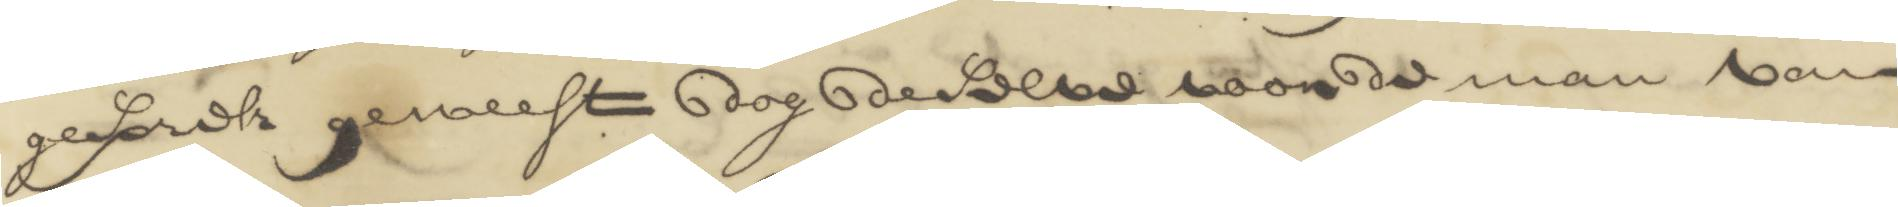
gesprek geweest dog deselve voor de man van
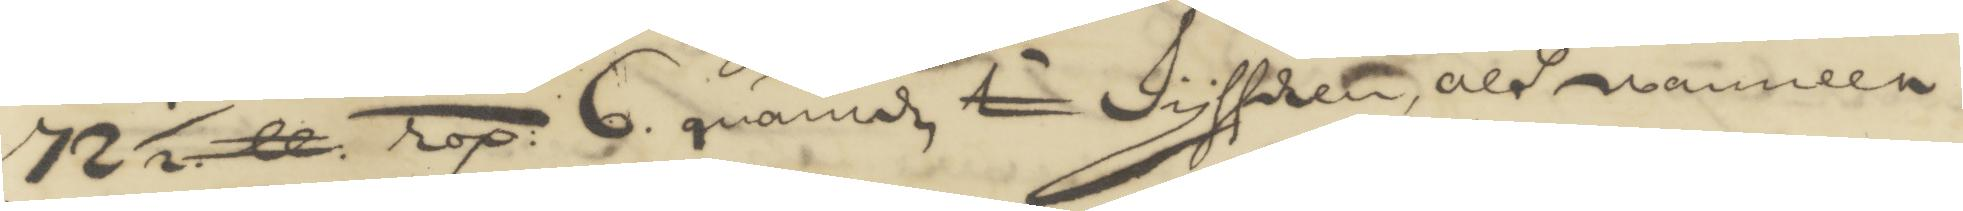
72½. lb: rop: 6. quamen t'Eijsschen, als wanneer
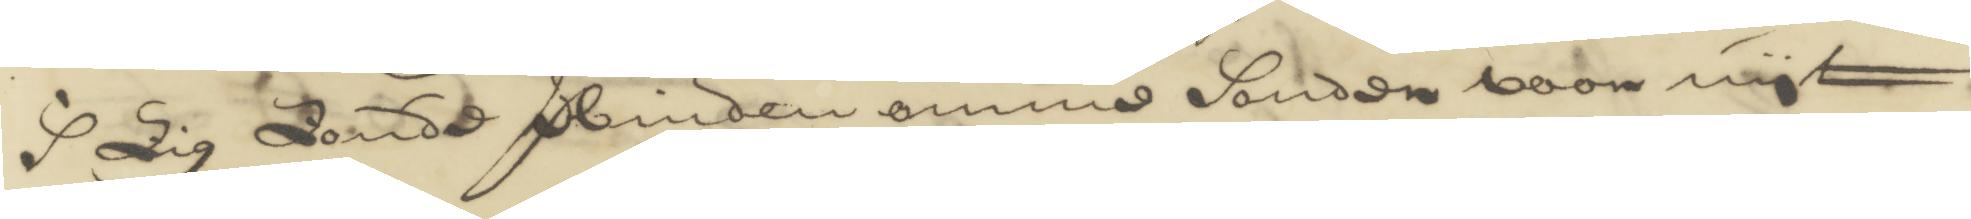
's zig zoude verbinden omme sonder voor uijt
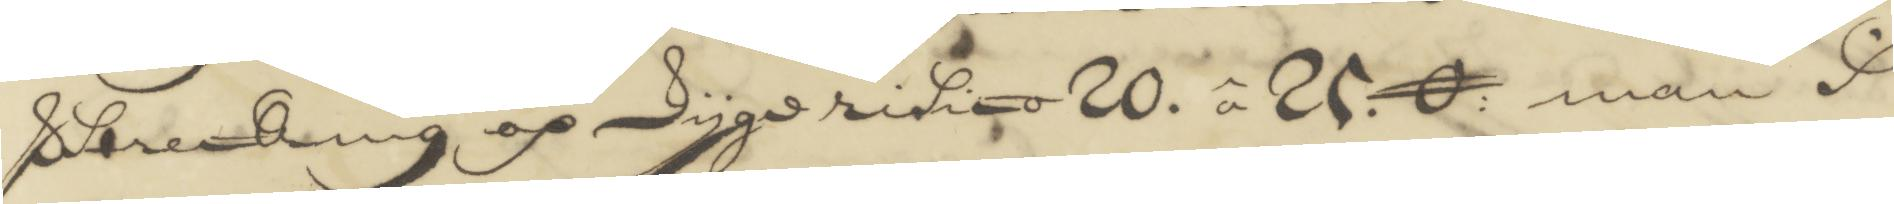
verstrecking op Eijge risico 20. â 25: Ø: man s'
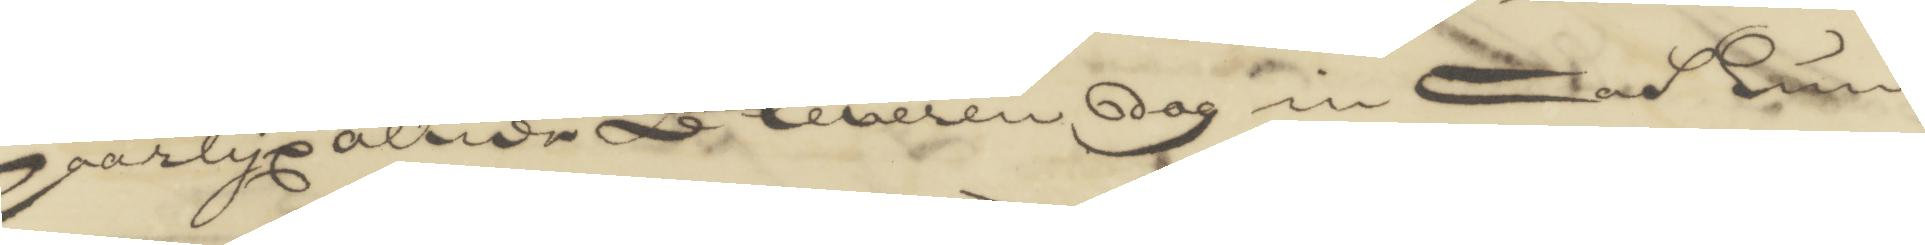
jaarlijx alhier te leveren dog in Cas hun
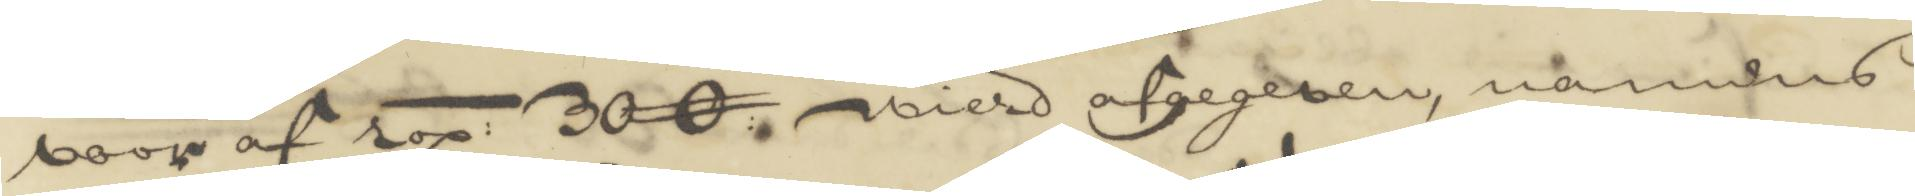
voor af rop: 30 Ø: wierd afgegeven, namens
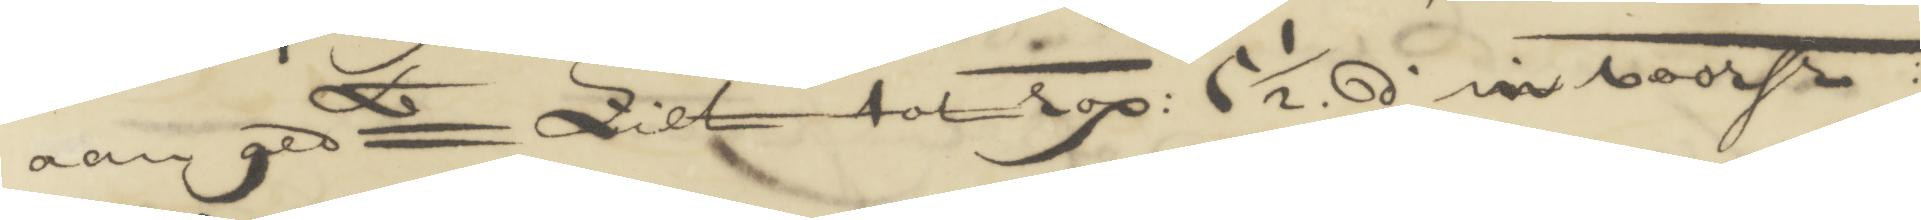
aan ges=t zilt tot rop: 5½. d' in voorsz:
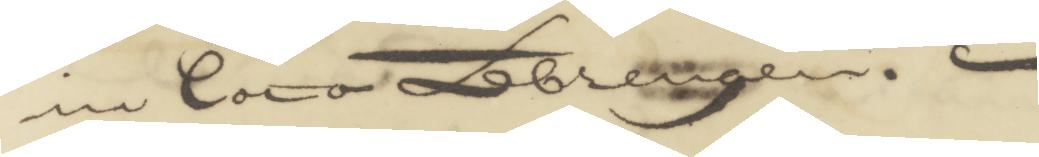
in loco tebrengen.
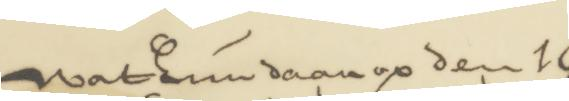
wat hun daar op den 19.
